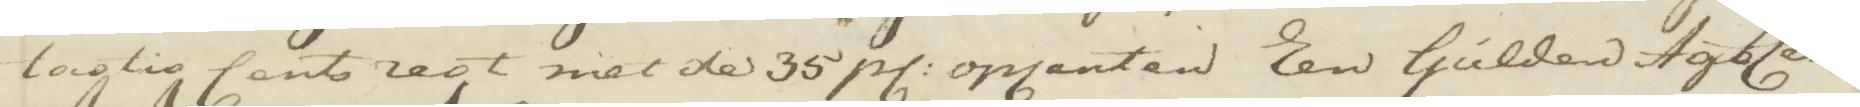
tagtig Cents rest met de 35 pC: opcenten Een Gulden Agt Cents
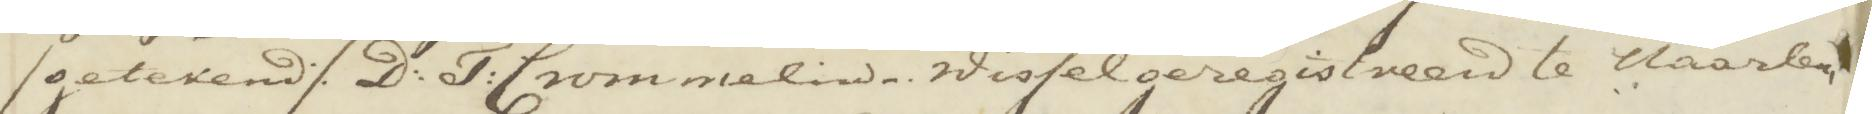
/getekend./. D: F: Crommelin -. wissel geregistreerd te Haarlem
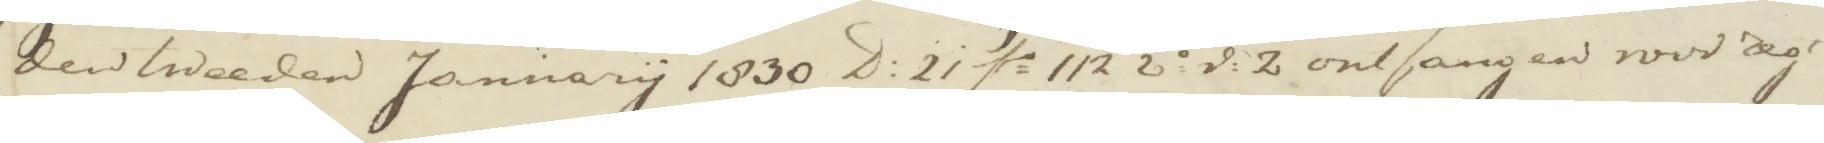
den tweeden Januarij 1830 D: 21 f=o 112 r=o v: 2 ontfangen voor regt
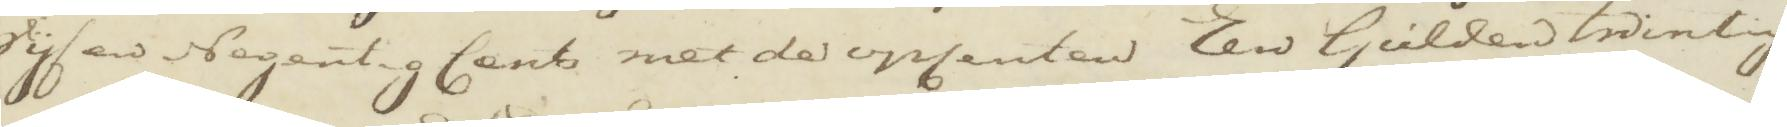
Vijf en Negentig Cents met de opcenten Een Gulden twintig
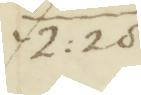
ƒ2:28
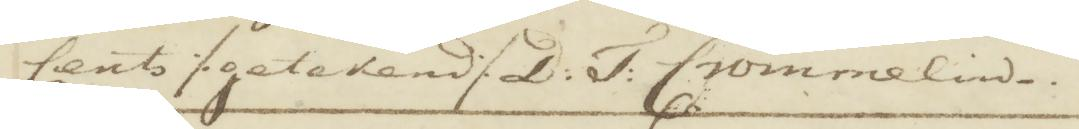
Cents ./.getekend./. D: F: Crommelin - .
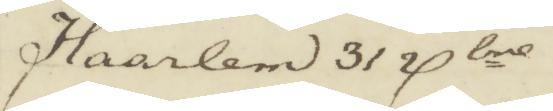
Haarlem 31 X=bre
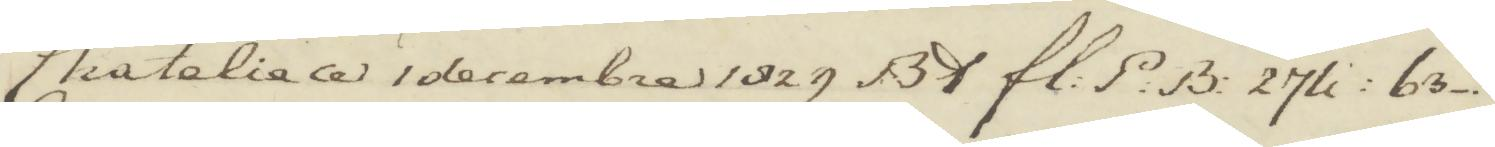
Chatelie ce 1 decembre 1829 131 fl: P: 13: 274: 63 -.
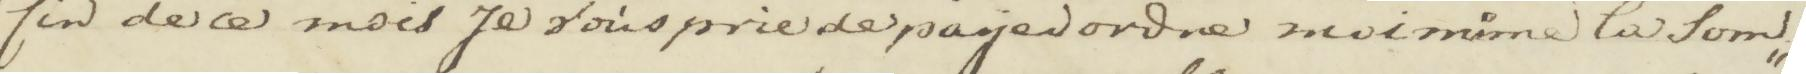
fin de ce mois Je vous prie de paijer ordre moimime la som„
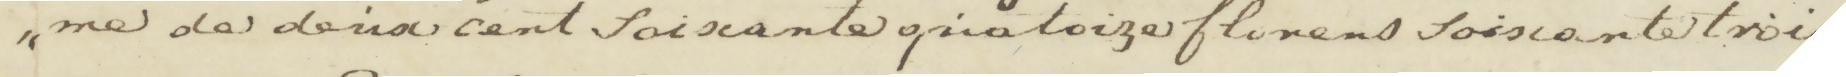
„me de deux cent soixante quatoize florens soixante trois
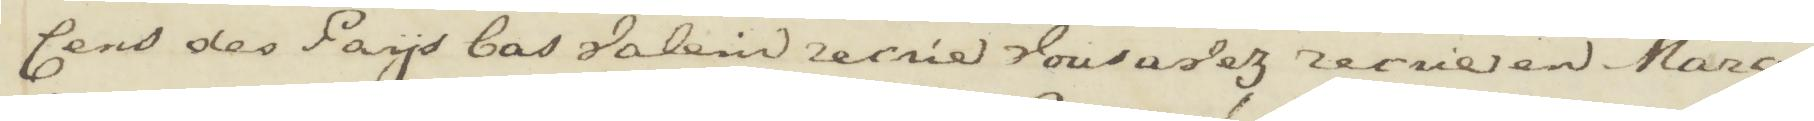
Cens des Paijs bas Valeur recrie Vous avez recrie en Marc,
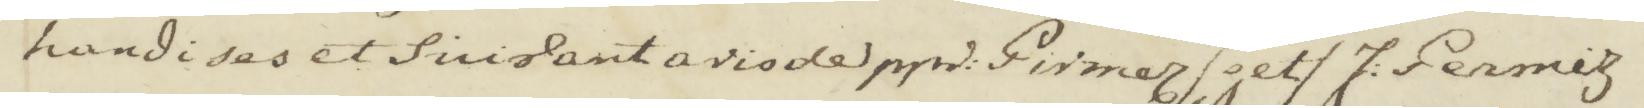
handises et suivant avis de ppd: Pirmez /get/ J: Permiz
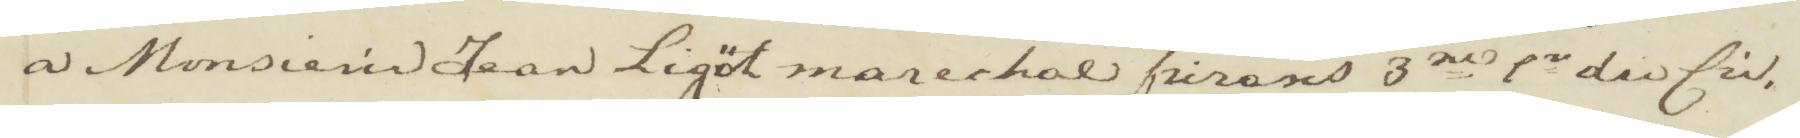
a Monsieur Jean Ligöt marechal frirons marechal pirens 3=m c=r du Cu,
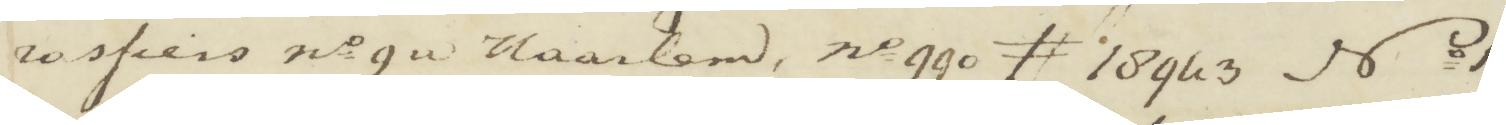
rassiers n=o 911 Haarlem, n=o 990 # 18943 N=o 1
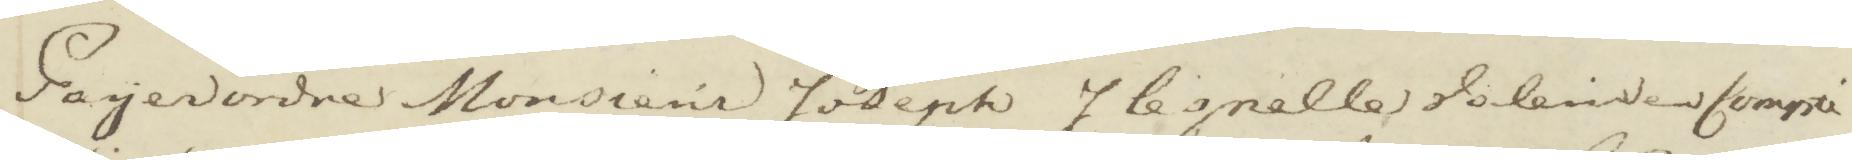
Paijer ordre Monsieur Joseph J legnolle Voleur en Compte
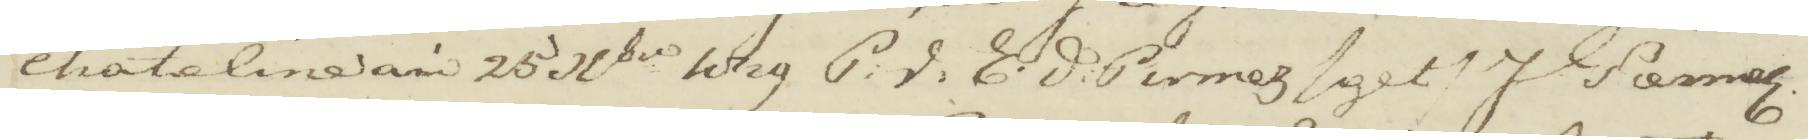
chateline au 25 X=bre 1829 P: V: E. d: Pirmez /get/ Jl Piermez.
